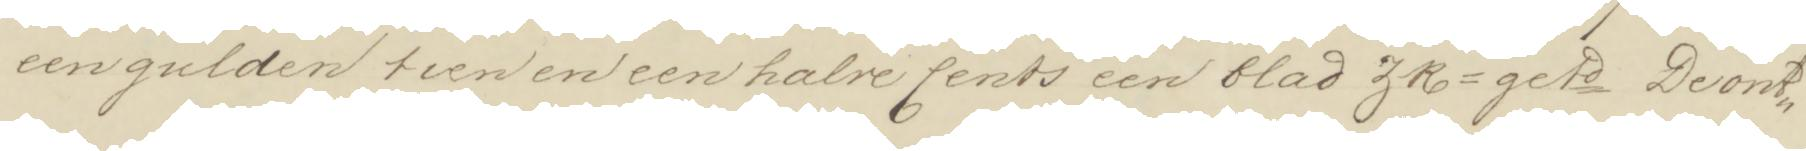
een gulden tien en een halve Cents een blad Zk = get=d De ont„
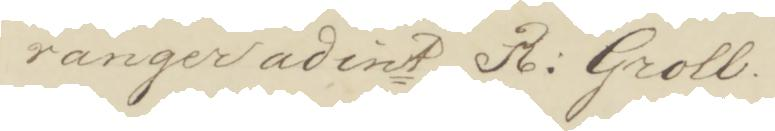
vanger ad in=t R: Groll.
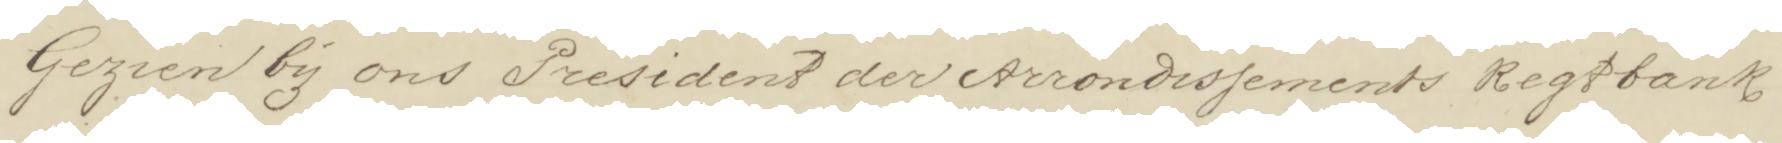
Gezien bij ons President der Arrondissements Regtbank
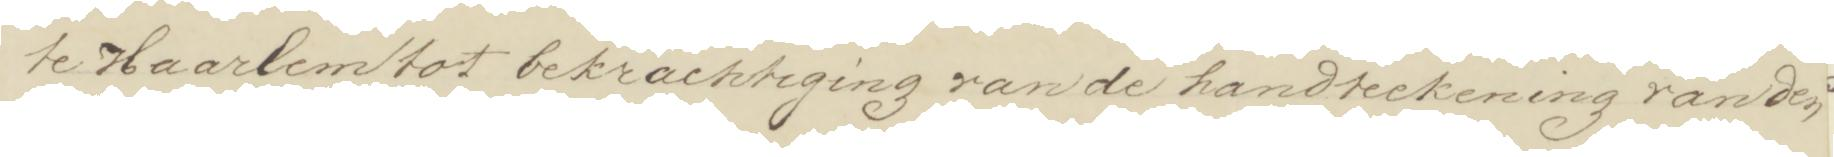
te Haarlem tot bekrachtiging van de handteekening van den
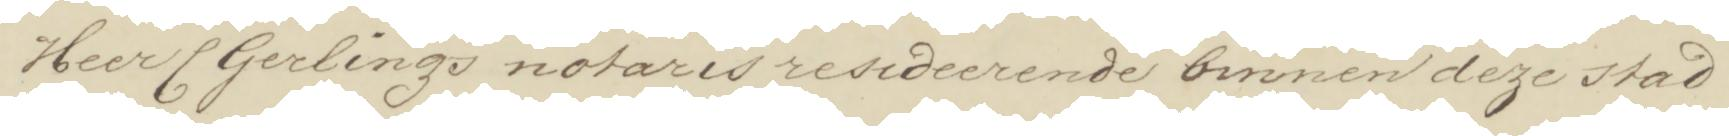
Heer C Gerlings notaris resideerende binnen deze stad
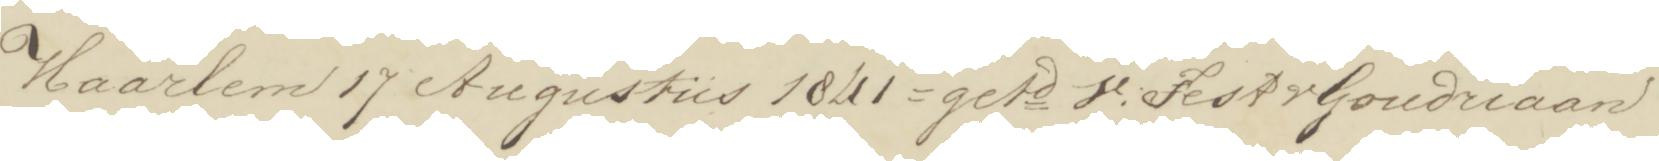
Haarlem 17 Augustus 1841= get=d V: Test v Goudriaan
